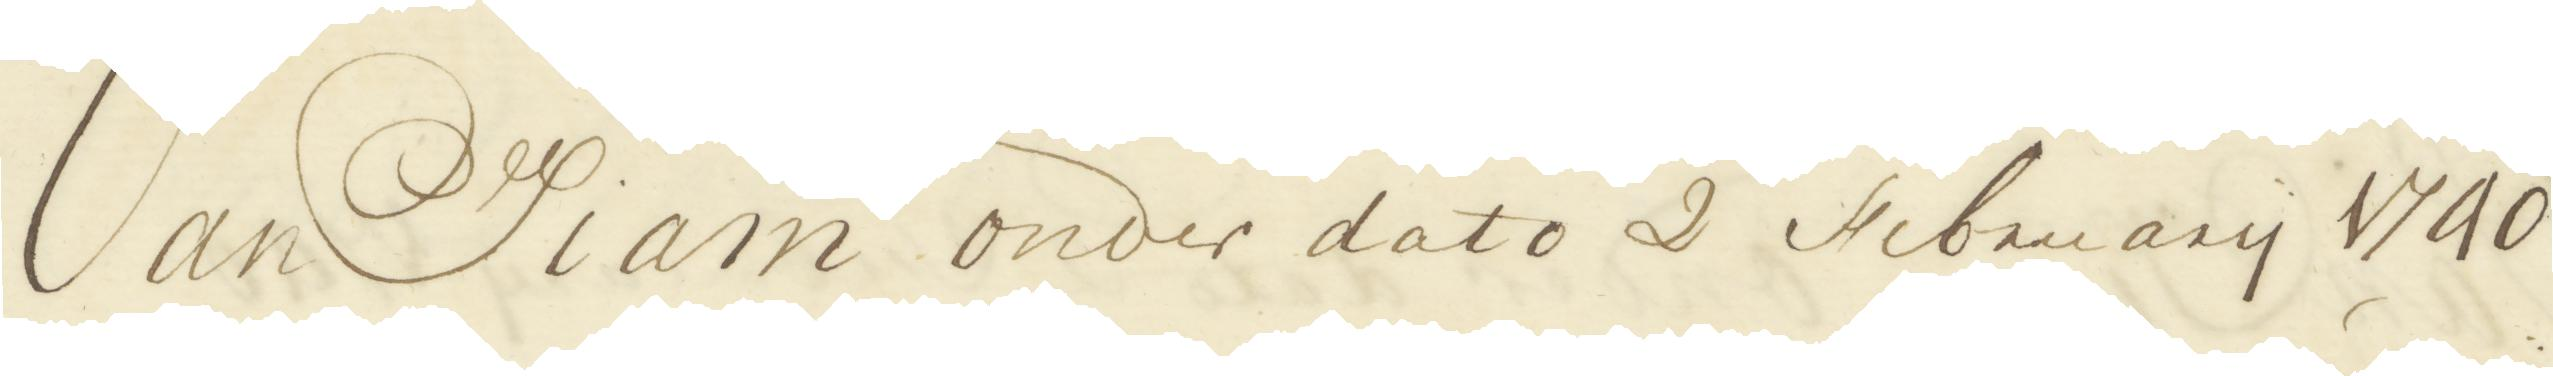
Van Siam onder dato 2 Februarij 1740
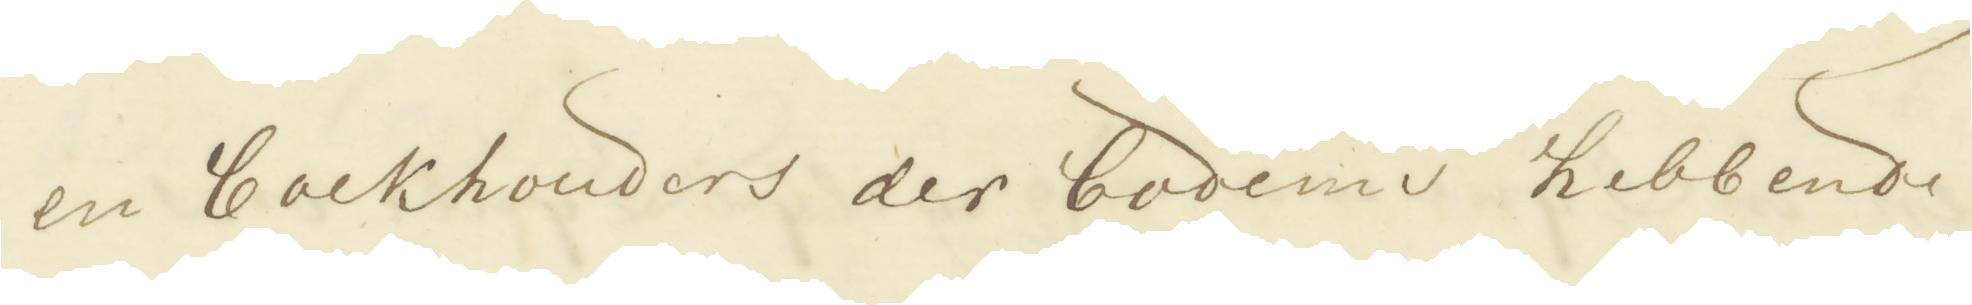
en boekhouders der bodems hebbende
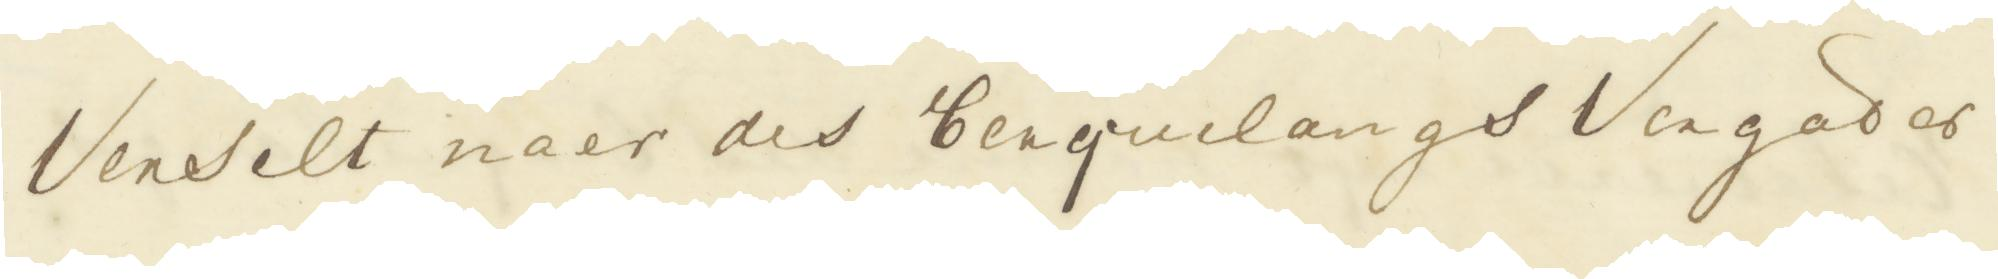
verselt naer des berquelangs Vergader
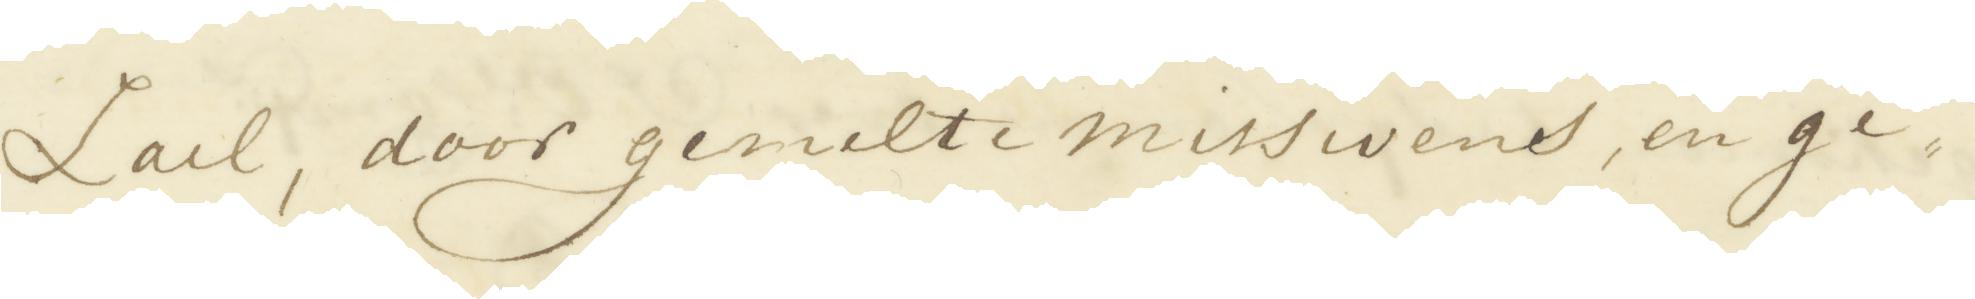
Sael, door gemelte missivens, en ge„
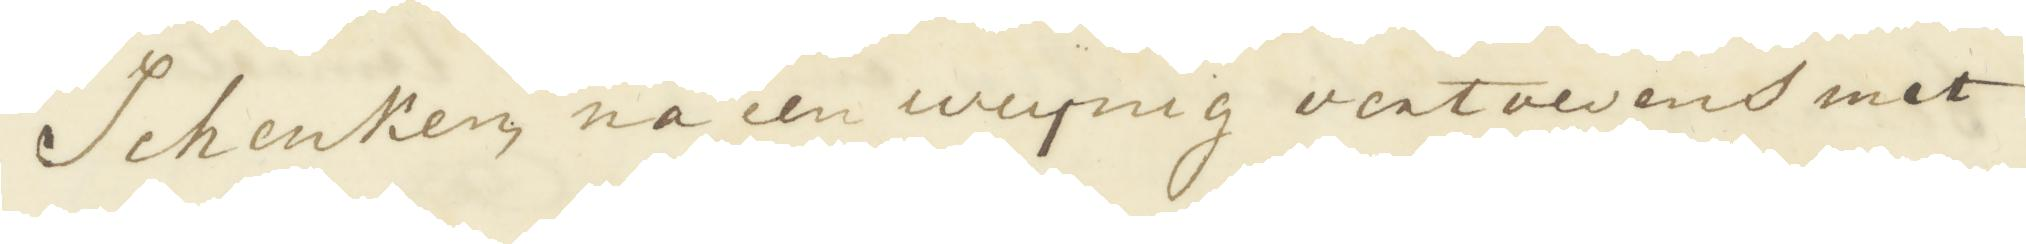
schenken na een weijnig vertoevens met
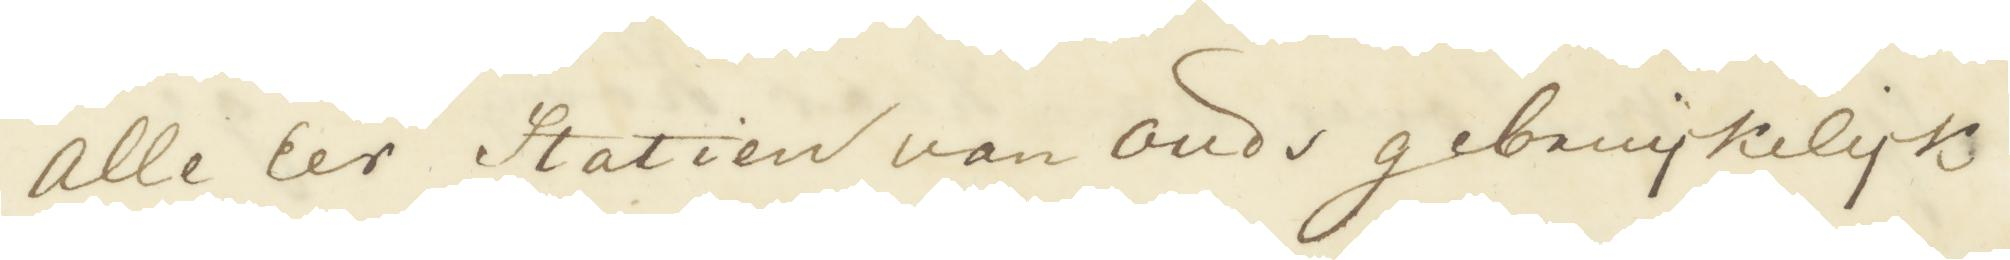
alle Eer statien van ouds gebruijkelijk
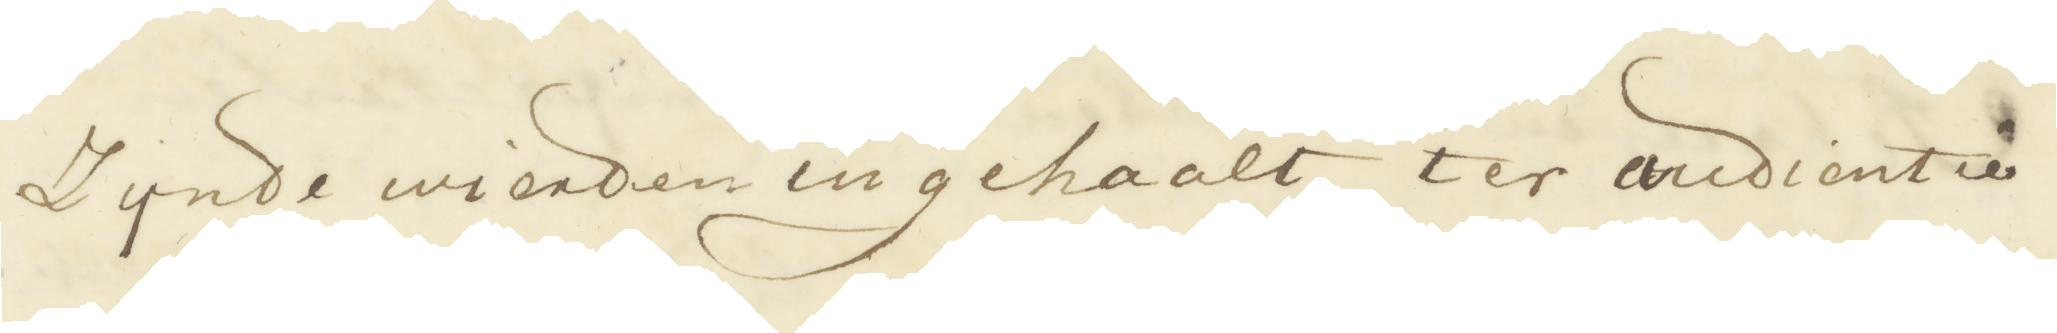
zijnde wierden ingehaalt, ter audientie
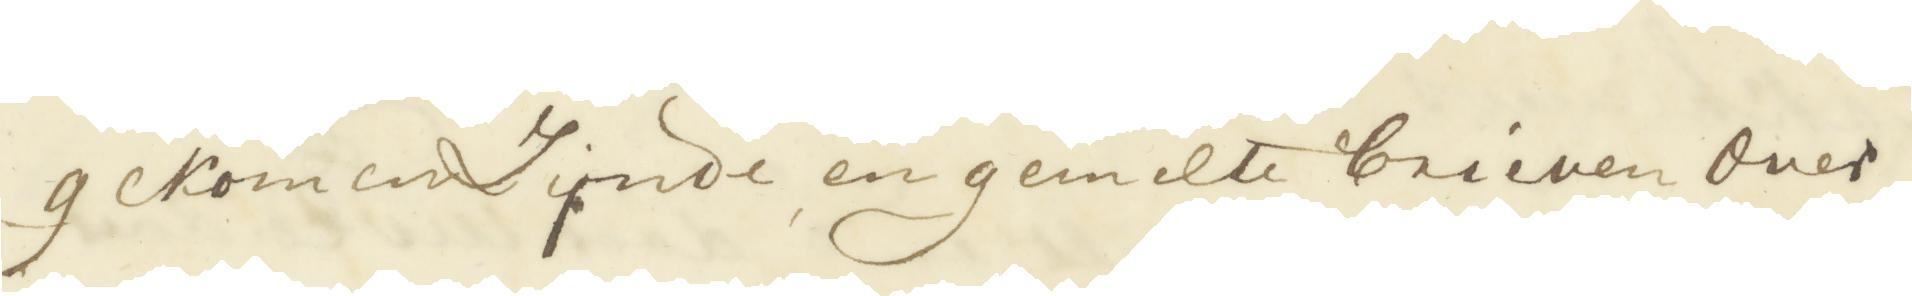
gekomen Zijnde, en gemelte brieven over
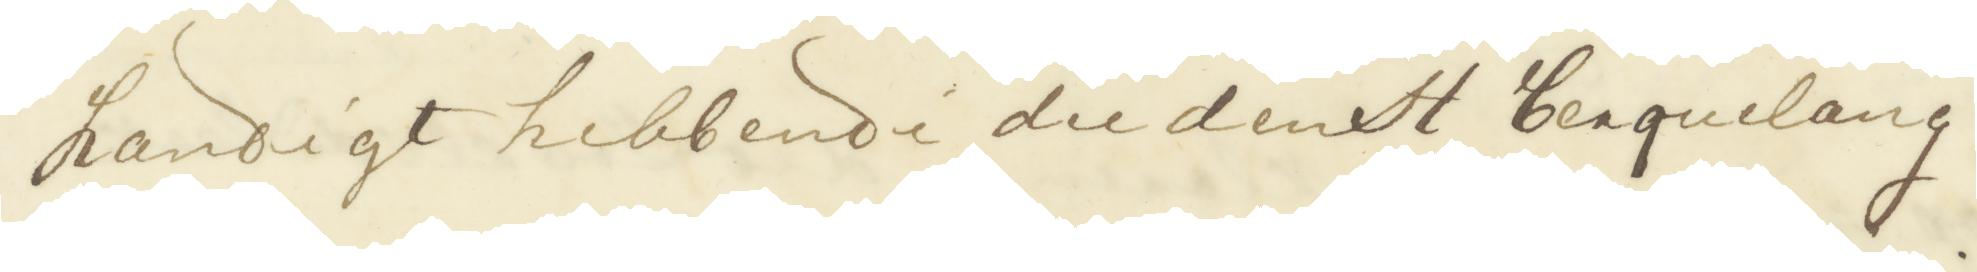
handigt hebbende die den H berquelang
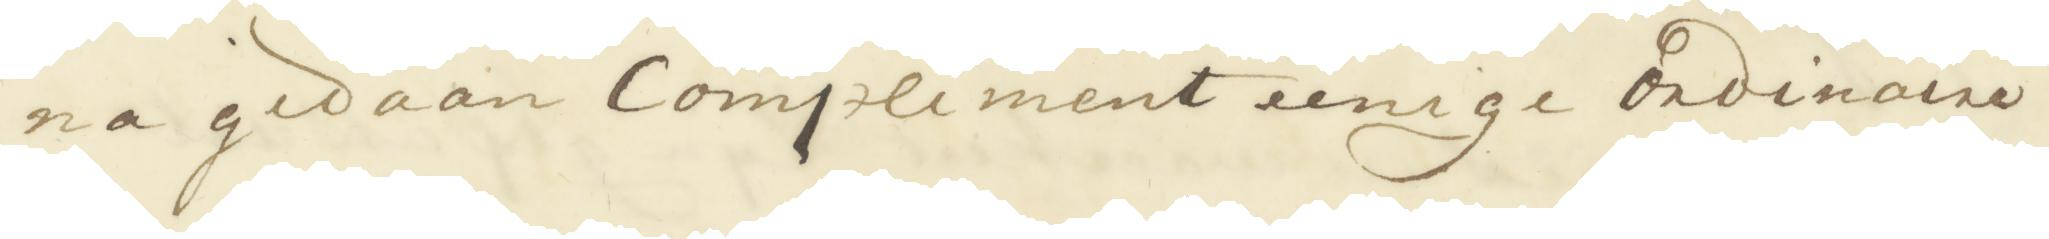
na gedaan Compliment eenige ordinaire
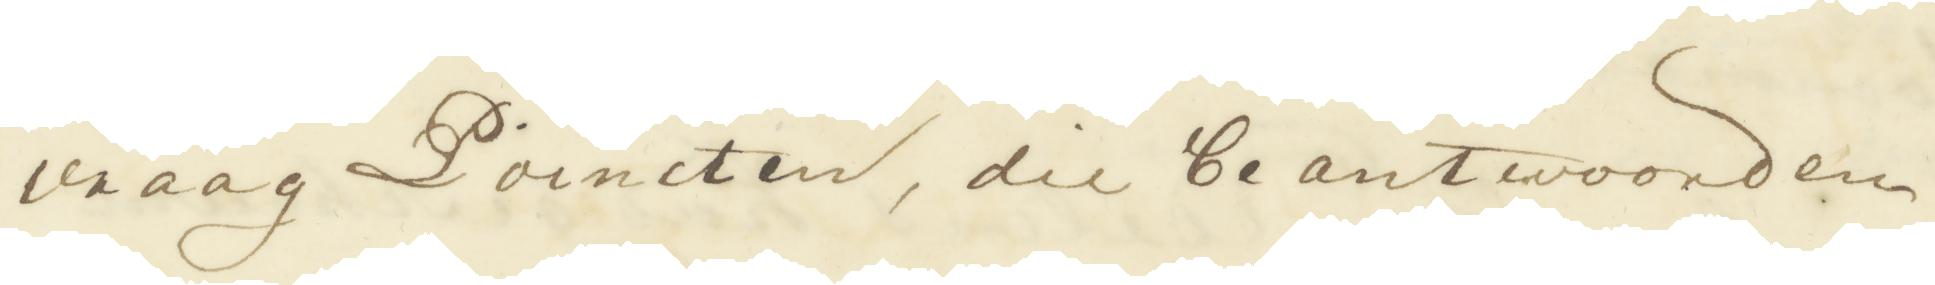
vraag Poincten, die beantwoorden
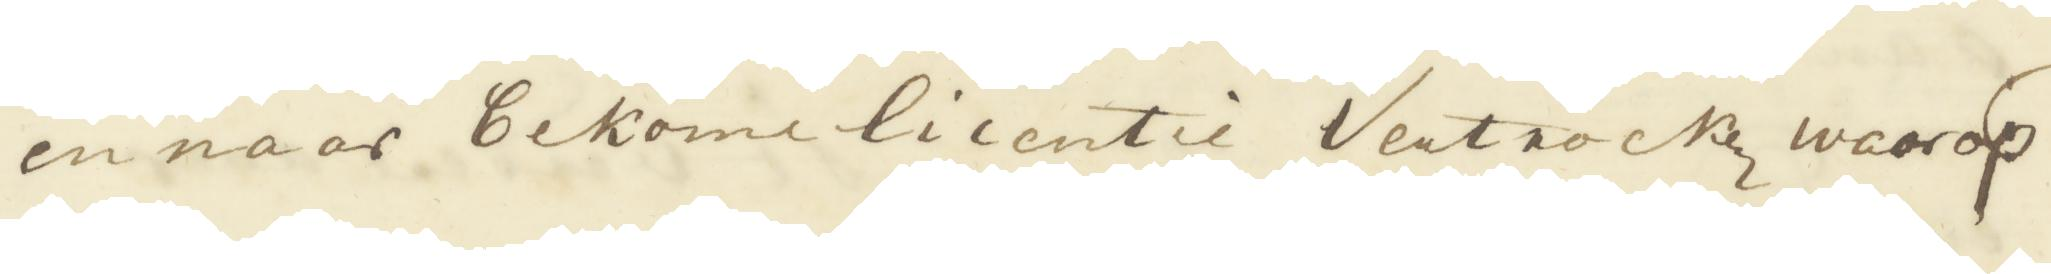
en naar bekome licentie Vertrocken waarop
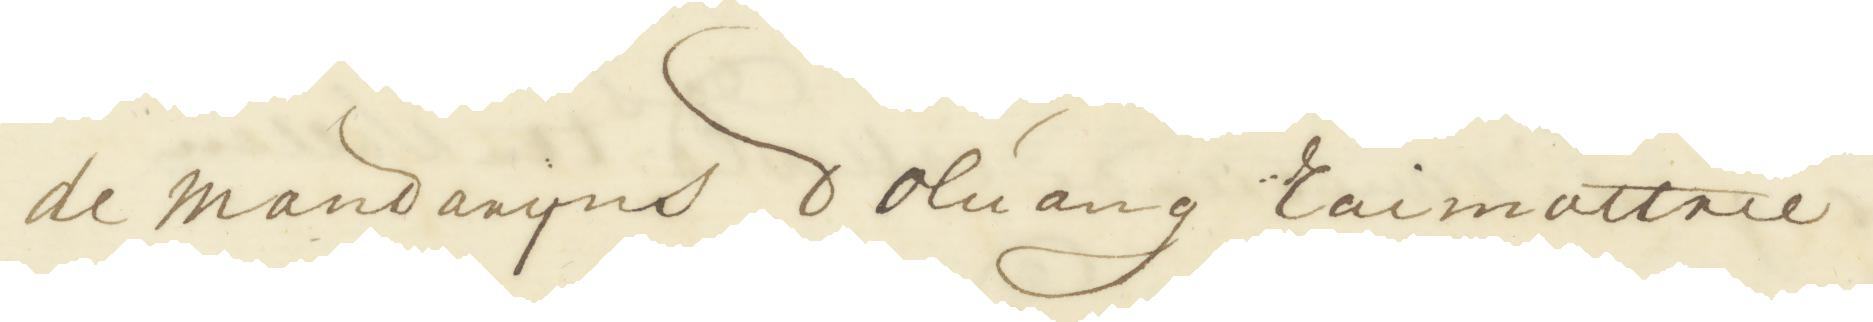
de mandarijns do luang raimottrie
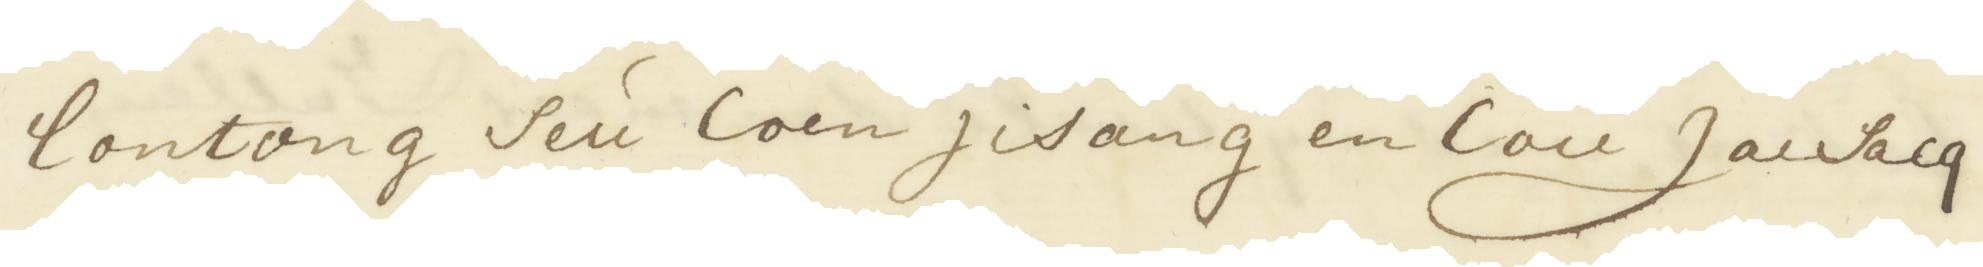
lontong seu coen jisang en cou Jaesacq
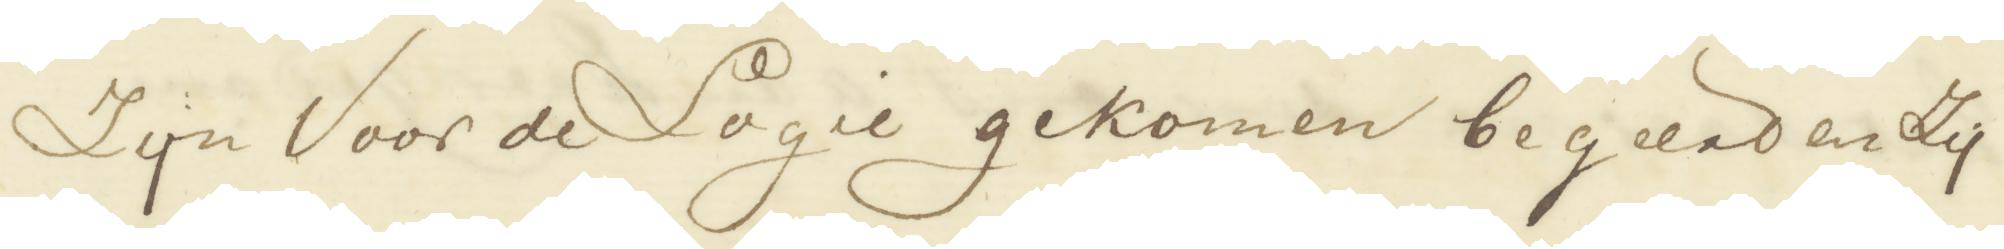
zijn Voor de Logie gekomen begeerden zij
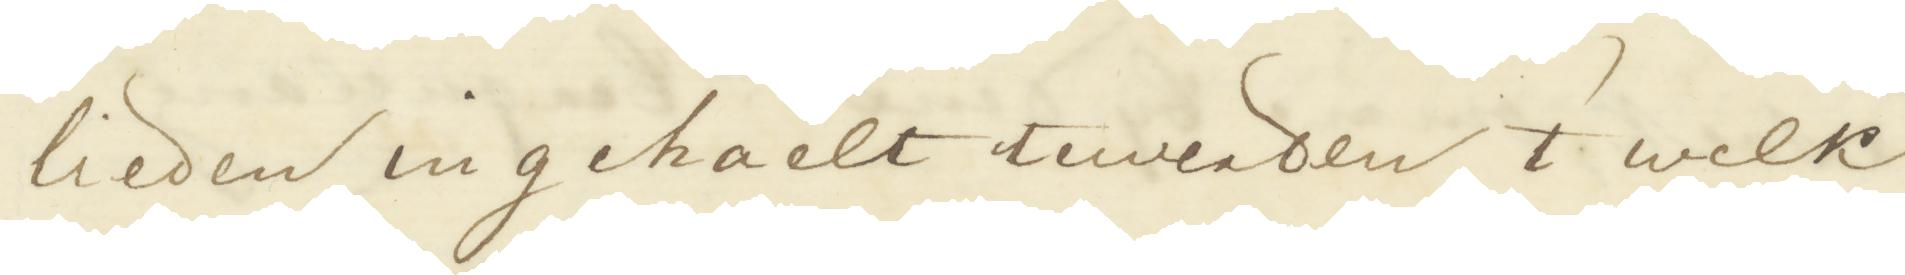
lieden ingehaelt te werden t' welk
